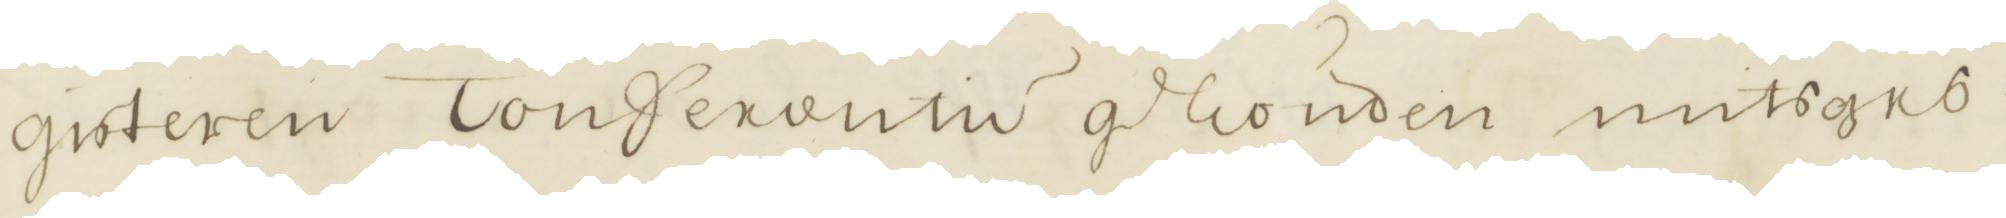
gisteren conferentie gehouden mitsgrs
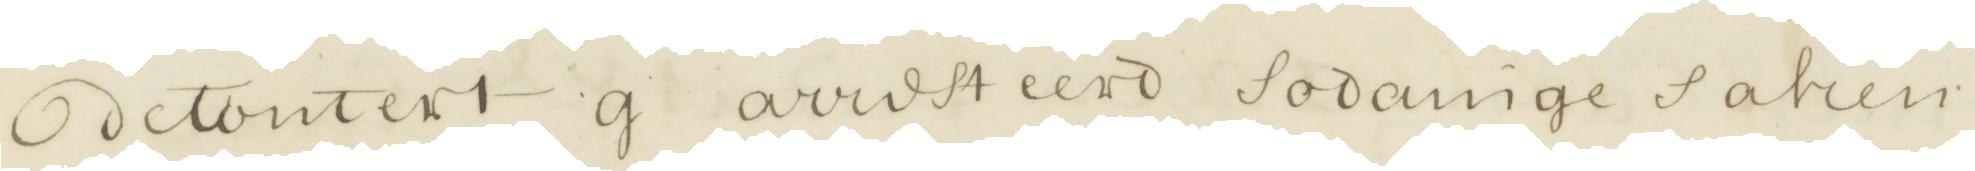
deconcert g’ arresteerd sodanige saken
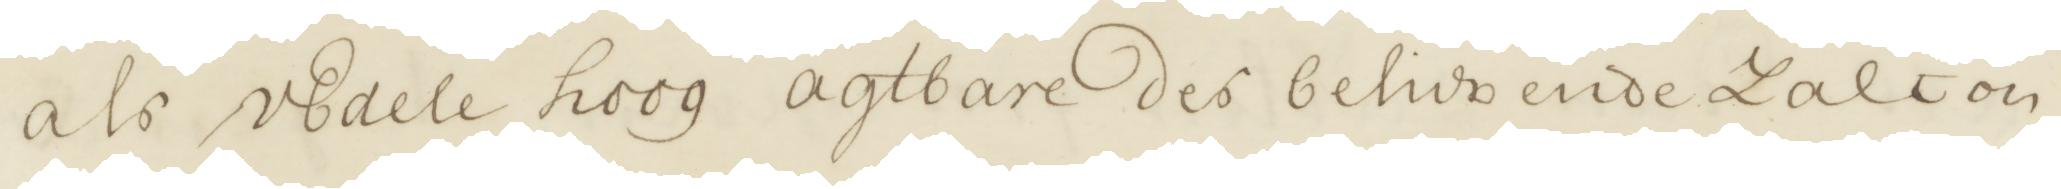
als vEdele hoog agtbare des believende zal con
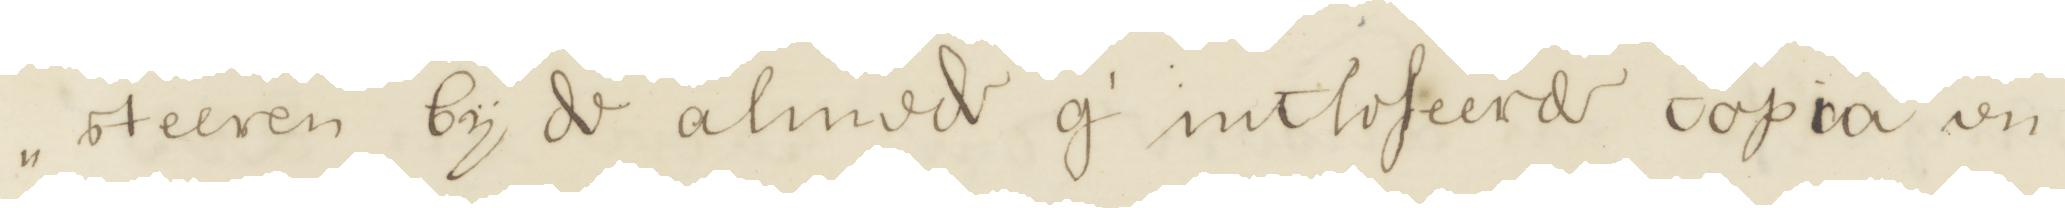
„steeren bij de almede g’ incloseerde copia en
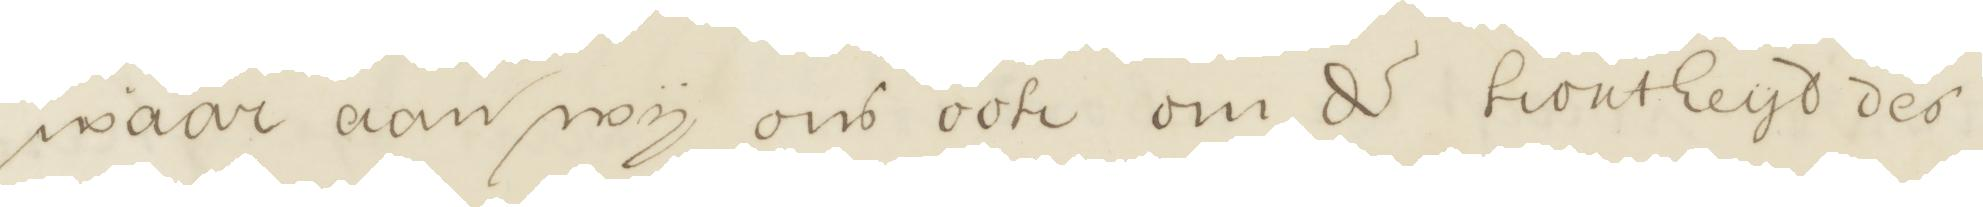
waar aan wij ons ook om de kortheijd des
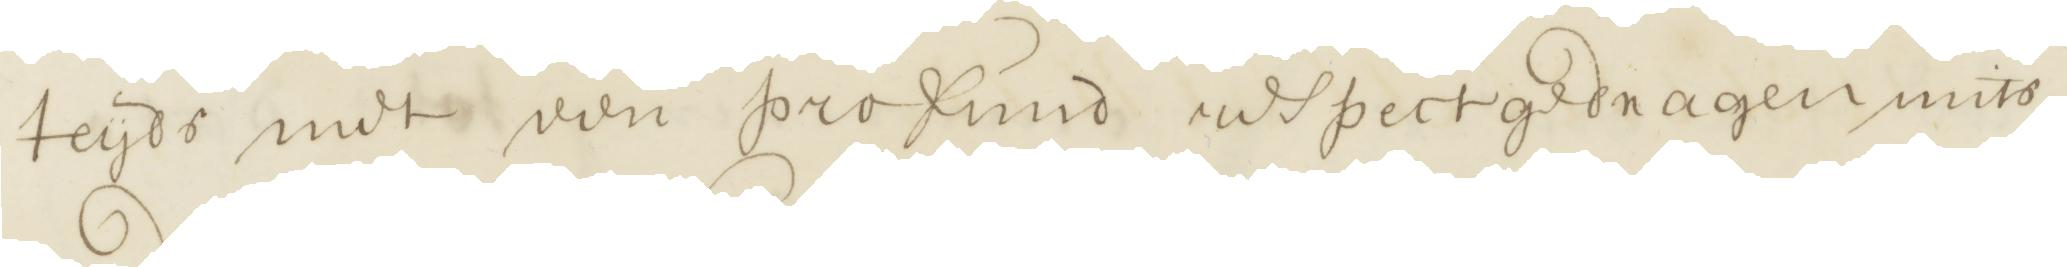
teijds met een profund respect gedragen mits
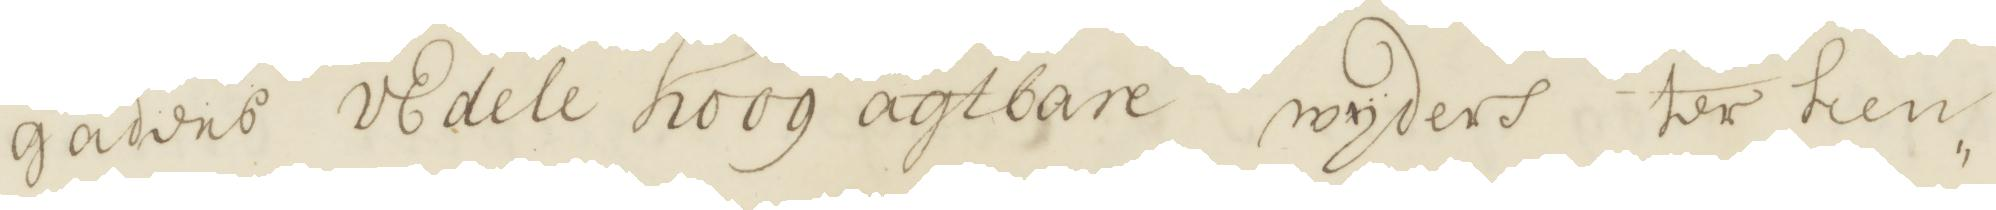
gaders VEdele hoog agtbare wijders ter ken„
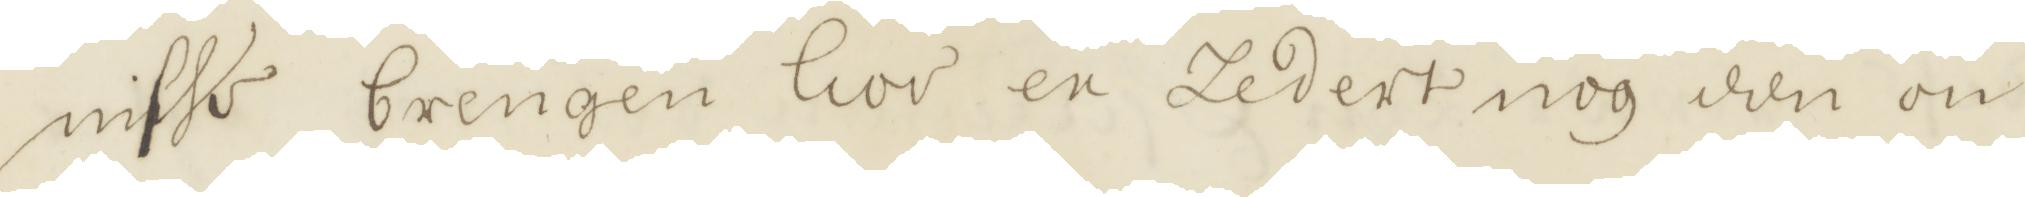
nisse brengen hoe er zedert nog een on
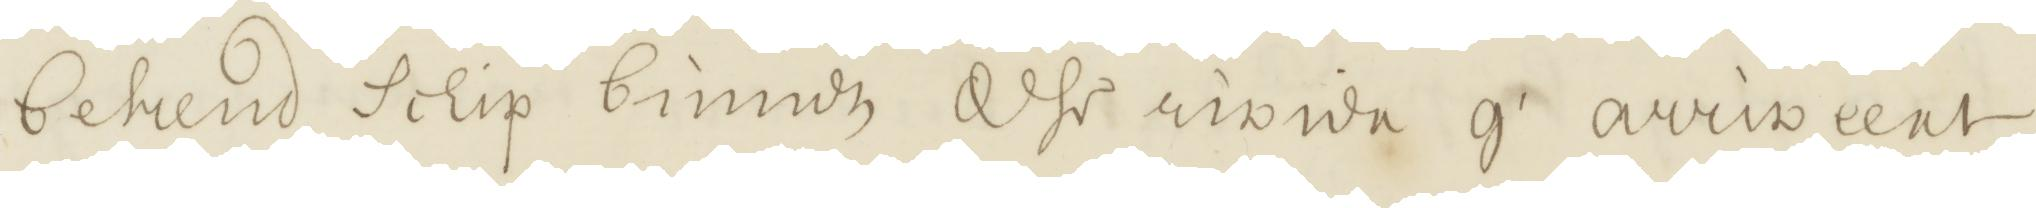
bekend schip binnen dese rivier g’ arriveert
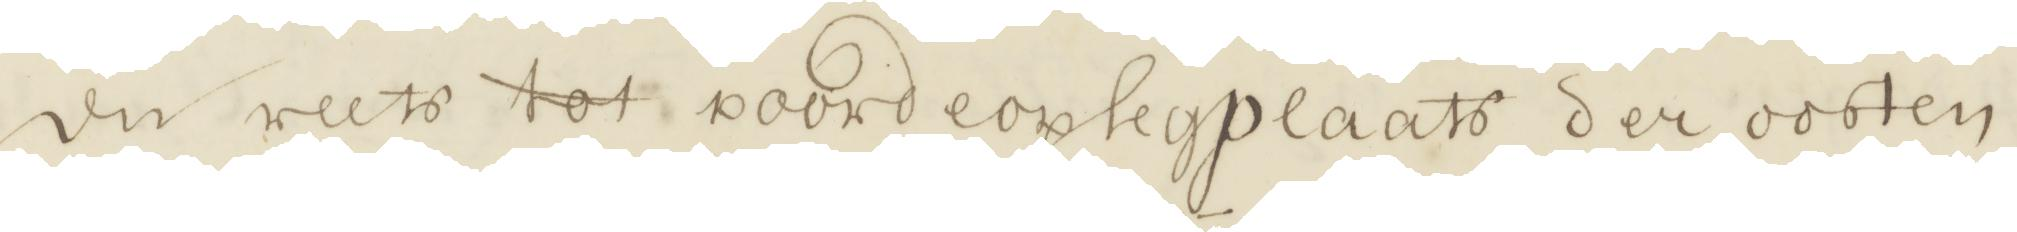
en reets tot voor de oplegplaats der oosten
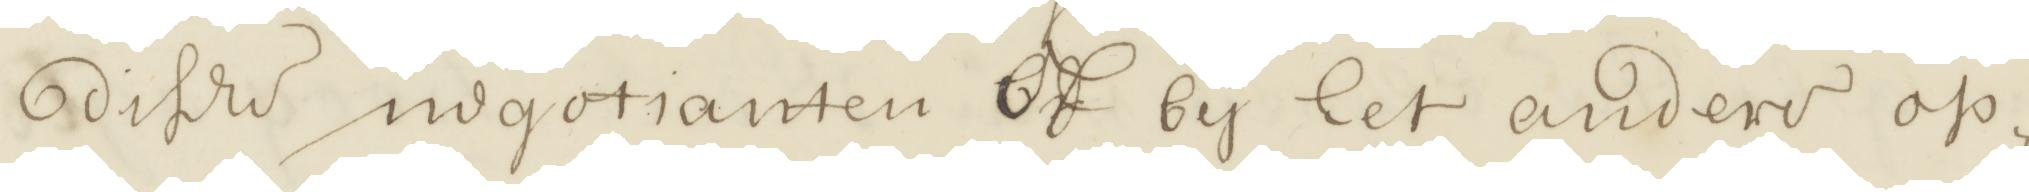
dische negotianten of bij het andere op
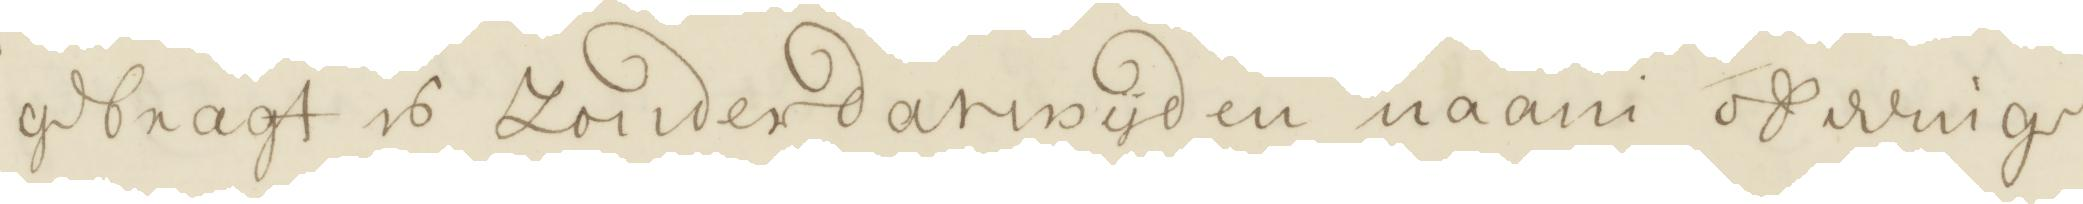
gebragt is zonder dat wij den naam of eenige
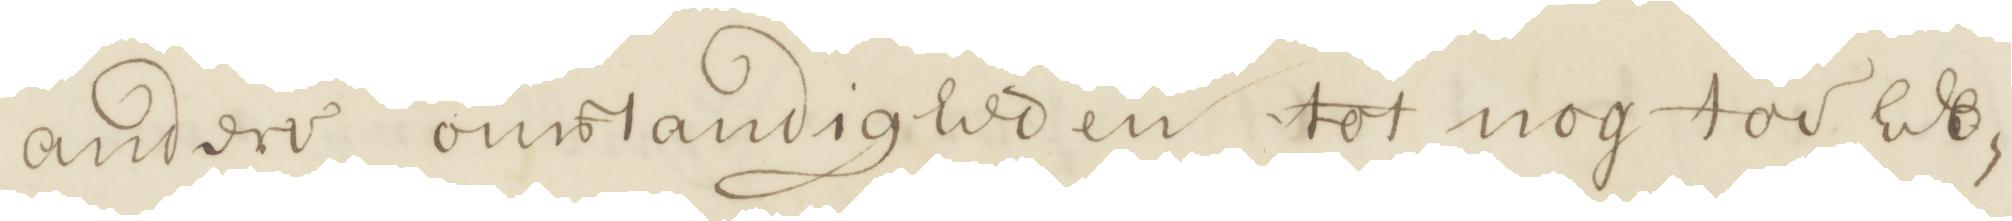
andere omstandigheden tot nog toe heb„
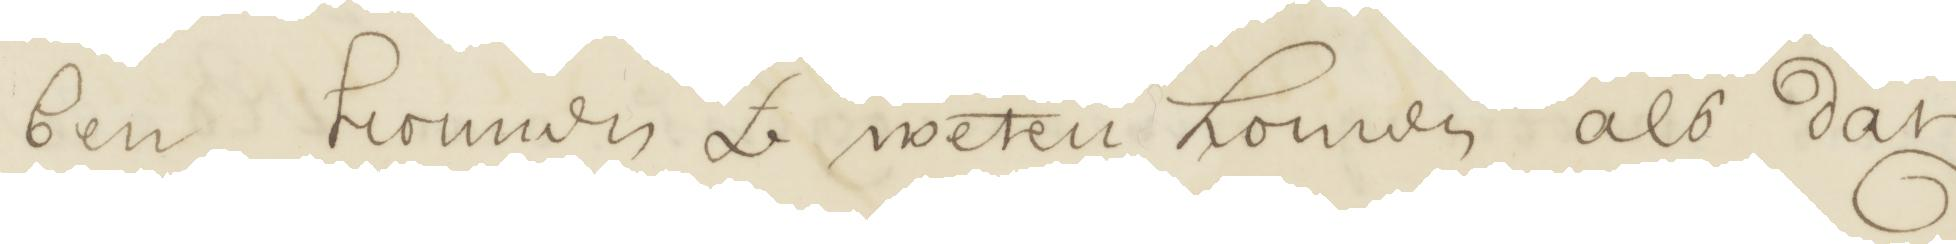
ben konnen te weten komen als dat
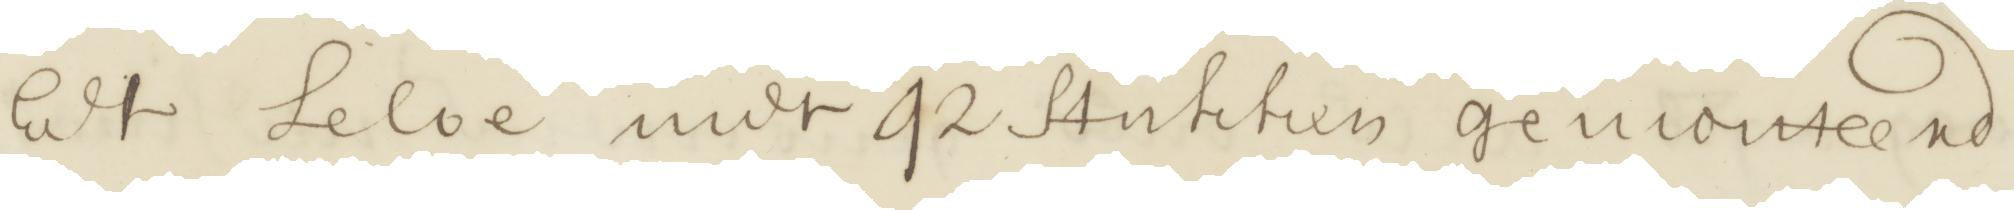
het zelve met 42 stukken gemonteerd
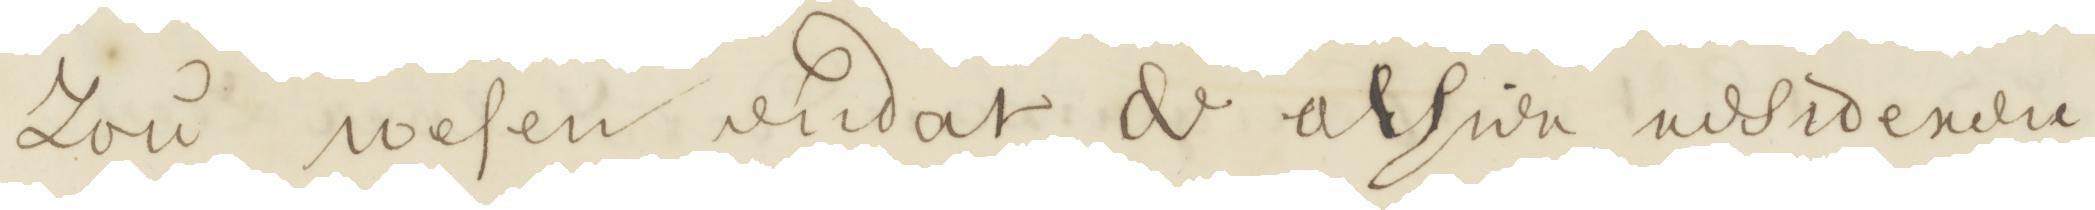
zou wesen en dat de alhier resideren
